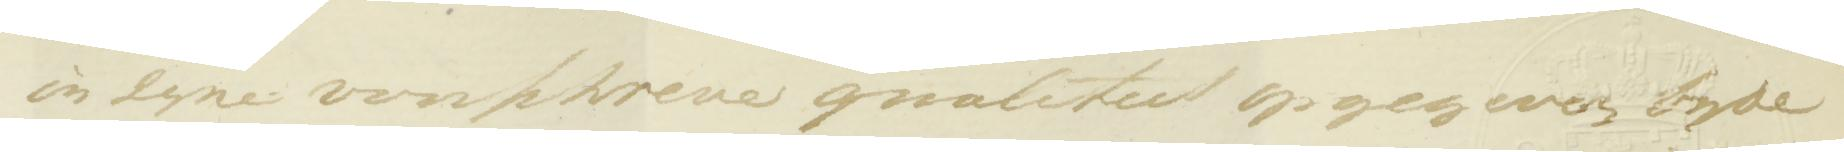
in zyne voorschreve qualiteit opgegeven by de
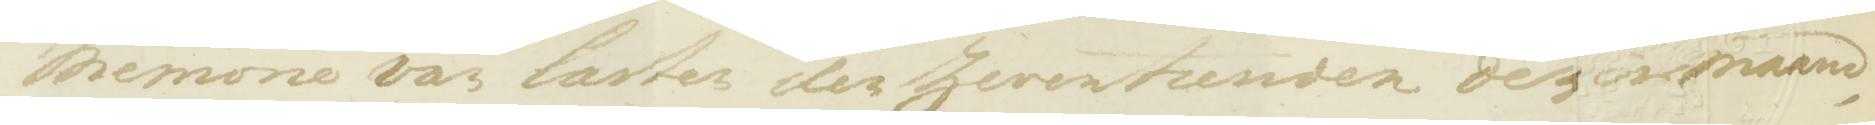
memorie van lasten den Zeventienden dezer maand,
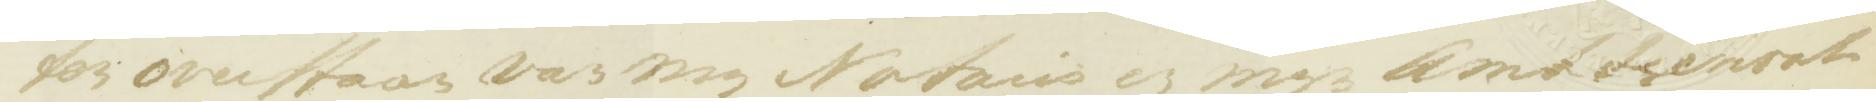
ten overstaan van my Notaris en myn ambtsgenoot
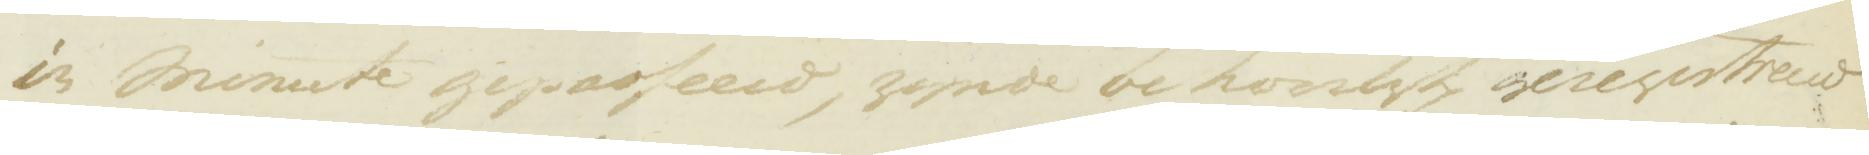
in minute gepasseerd, zynde behoorlyk geregistreerd
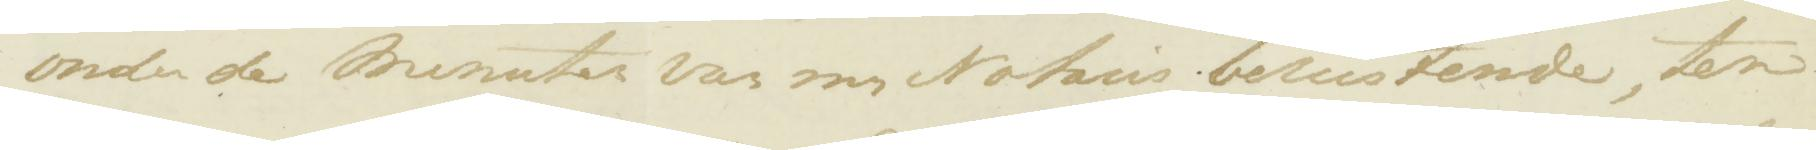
onder de minuten van my Notaris berustende, ten
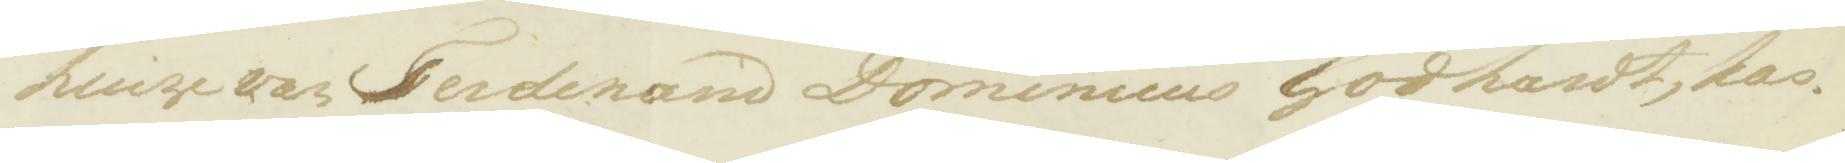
huize van Ferdinand Dominicus Godhardt, kas,
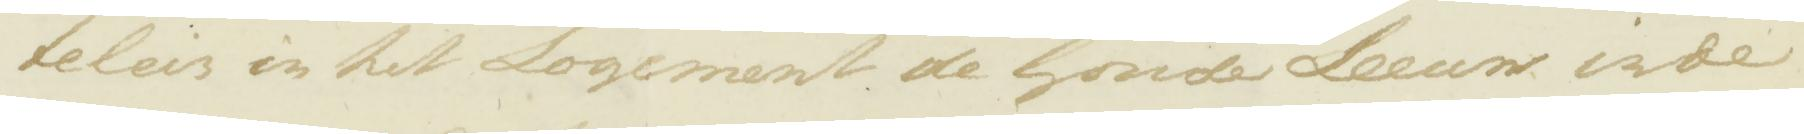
telein in het Logement de Goude Leeuw in de
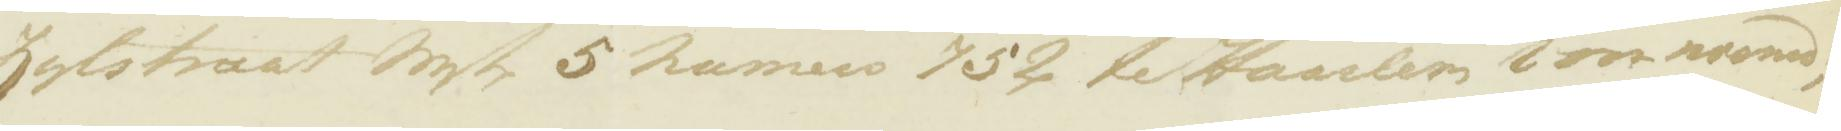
Zylstraat wyk 5 numero 752 te Haarlem voornoemd,
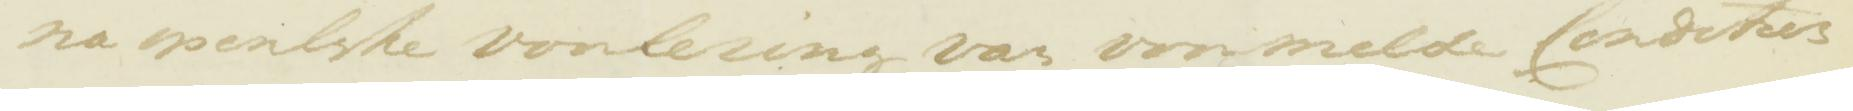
na openlyke voorlezing van voormelde Conditien
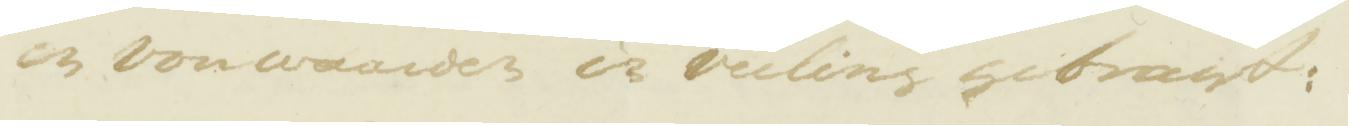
en voorwaarden in veiling gebragt:
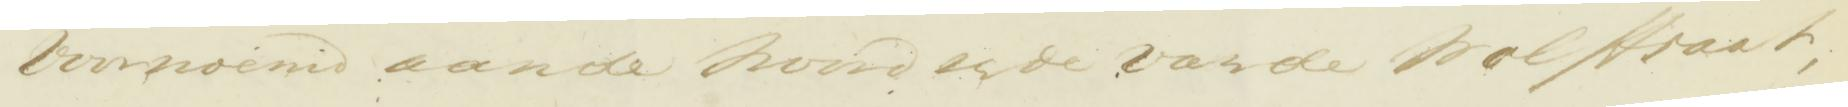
voornoemd aan de Noordzyde van de Walstraat,
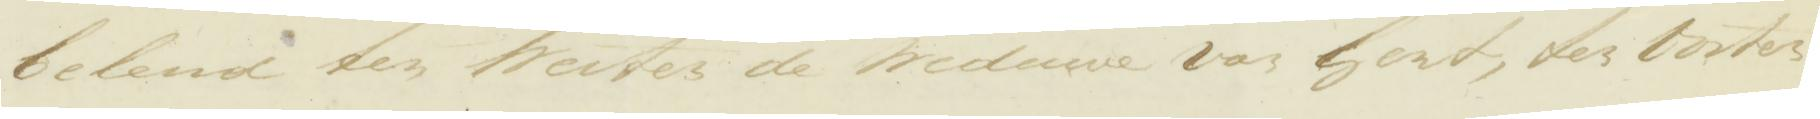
belend ten westen de weduwe van Gert, ten Oosten
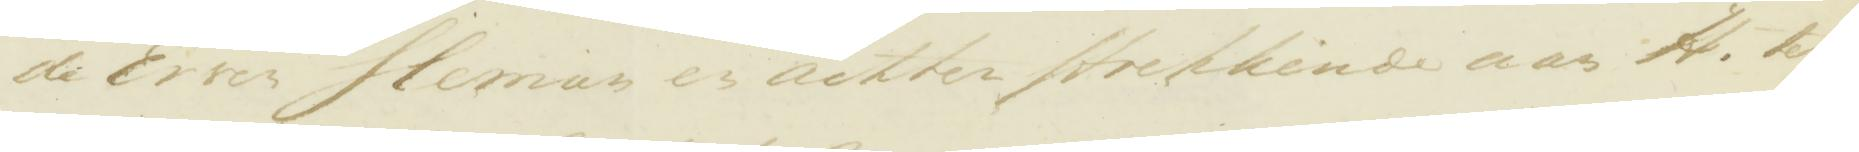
de Erven Sleman en achter strekkende aan H. ter
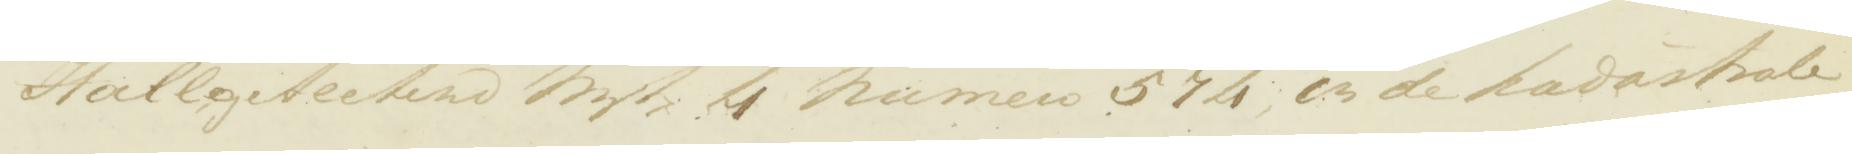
Hall, geteekend Wyk 4 numero 574; in de kadastrale
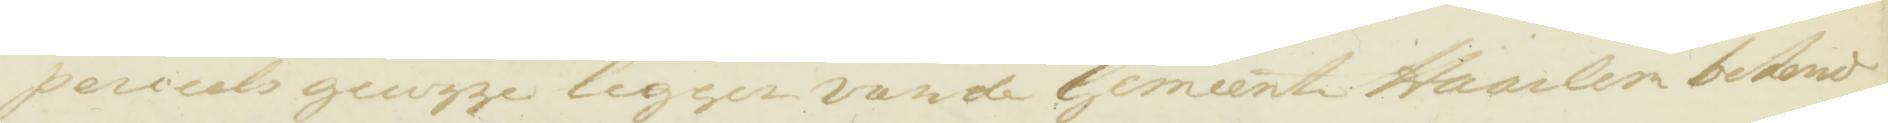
perceels gewyze legger van de Gemeente Haarlem bekend
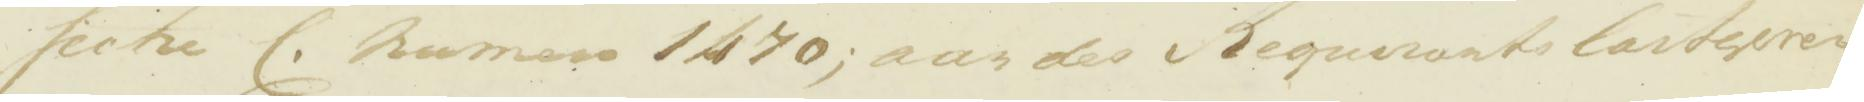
sectie C: numero 1470; aan den Requirants lastgeven
